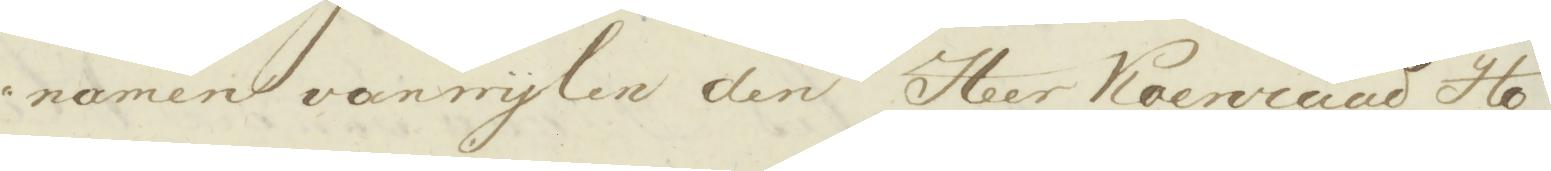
„namen van wijlen den Heer Koenraad Ho
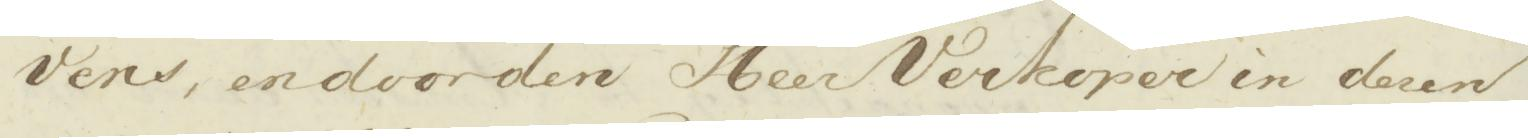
vens, en door den Heer Verkoper in dezen
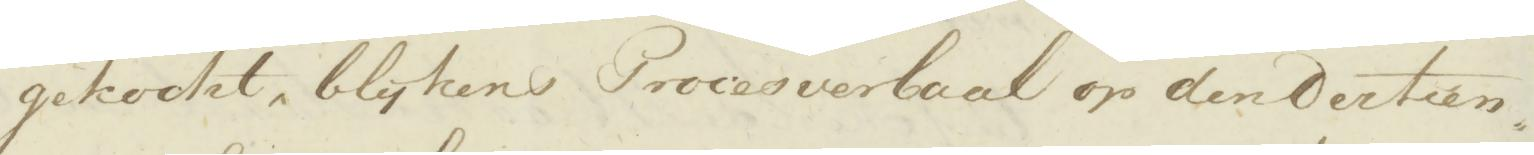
gekocht, blykens Procesverbaal op den dertien„
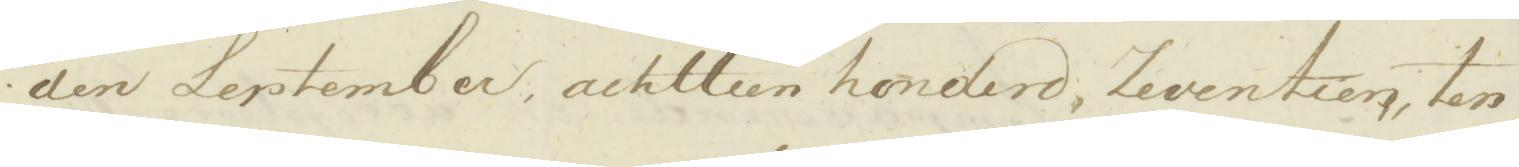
den September, achttien honderd, zeventien, ten
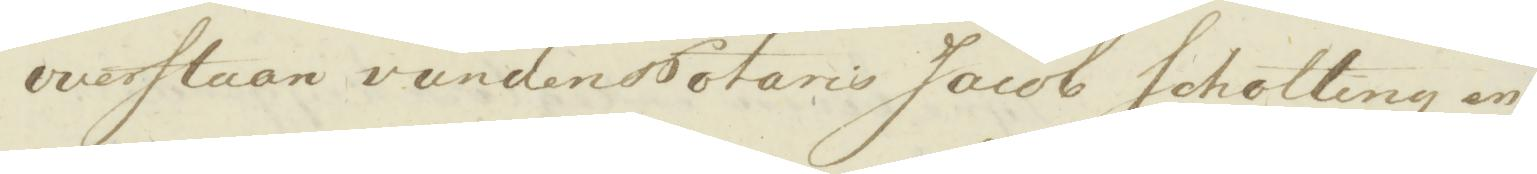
overstaan van den Notaris Jacob Scholting en
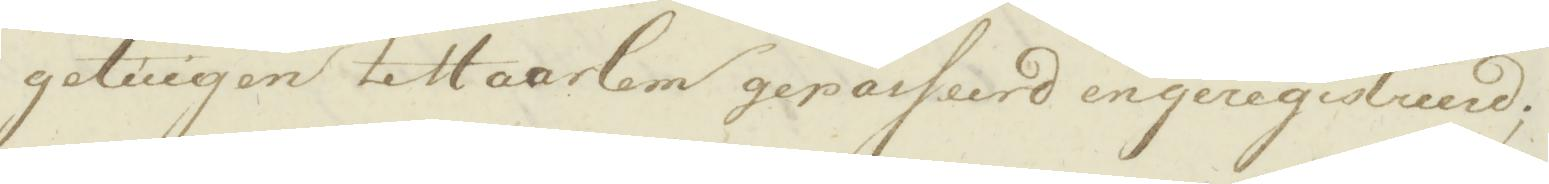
getuigen te Haarlem gepasseerd en geregistreerd;
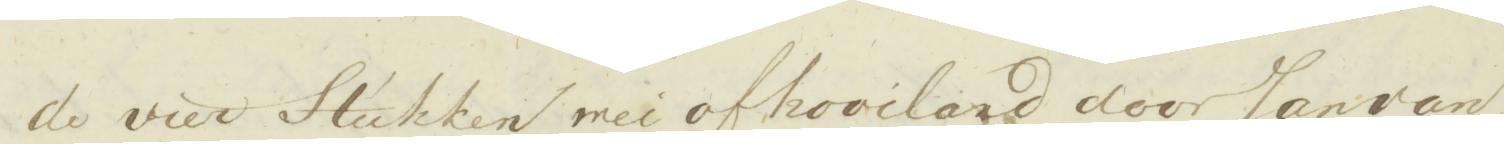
de vier stukken wei of hooilard door Jan van
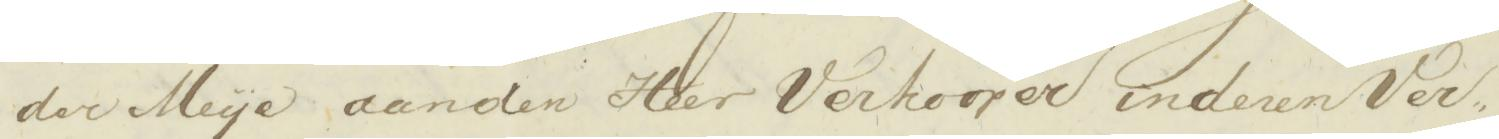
der Meije aan den Heer Verkooper indezen Ver„
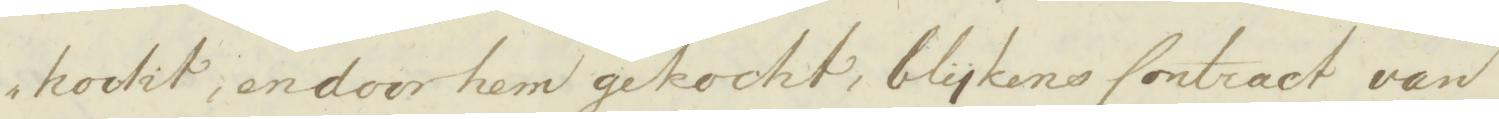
„kocht, en door hem gekocht, blijkens Contract van
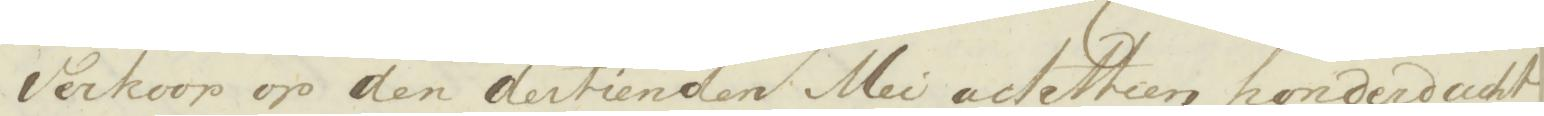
verkoop op den dertienden Mei achttien honderd acht=
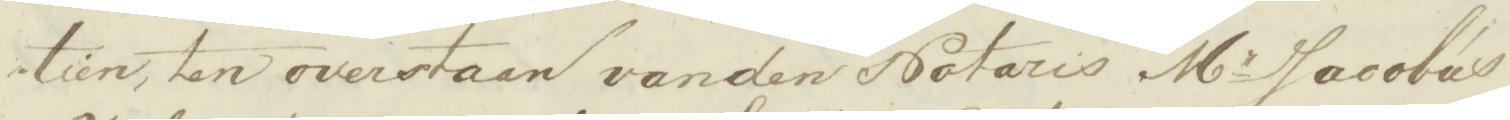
„tien, ten overstaan van den Notaris M=r Jacobus
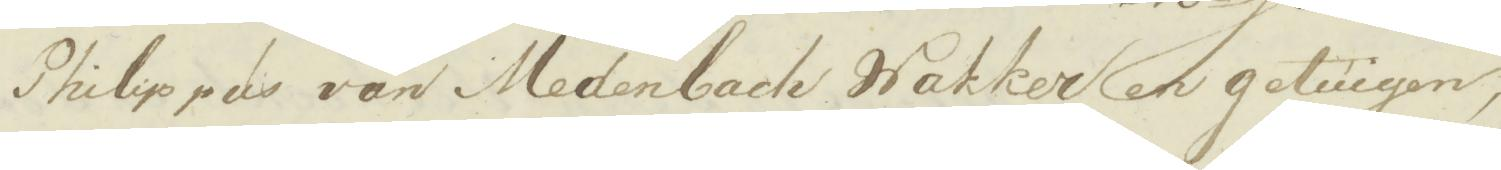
Philippus van Medenbach Wakker en getuigen,
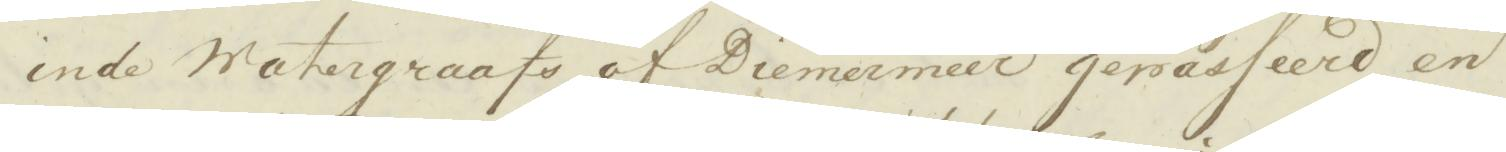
in de Watergraafs of Diemermeer gepasseerd en
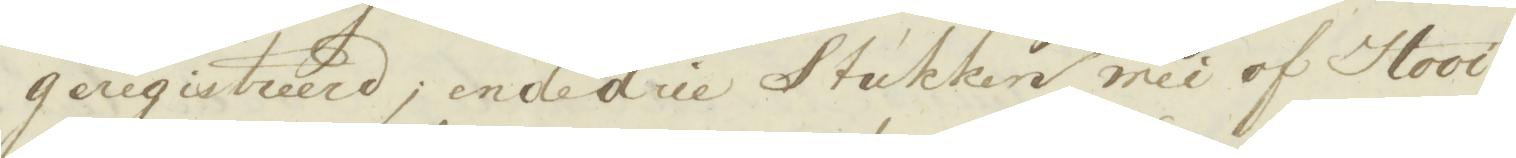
geregistreerd; en de drie stukken wei of Hooi
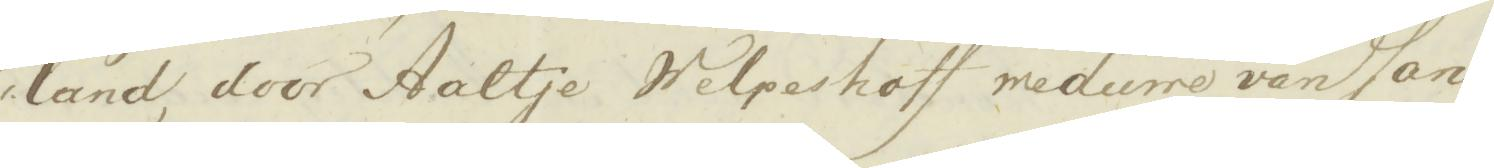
„land door Aaltje Welpeshoff weduwe van Jan
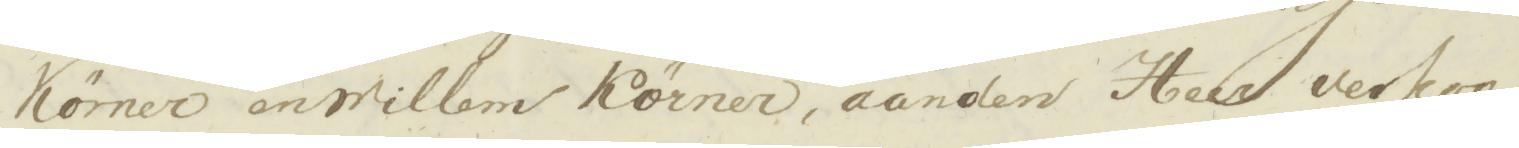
Körner en willem Körner, aan den Heer verkoo
